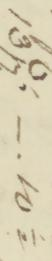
13 pCt —. 10½
